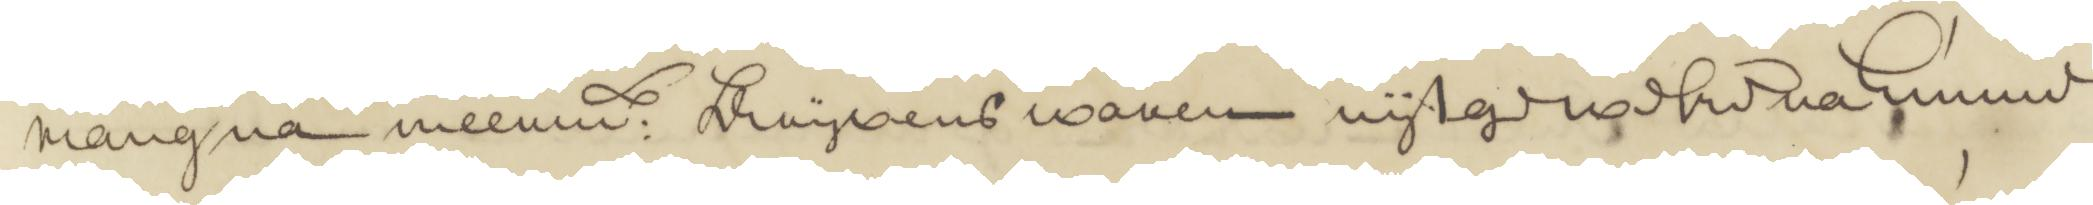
riang na meerm:s schrijvens waren uijtgeweke na hunne
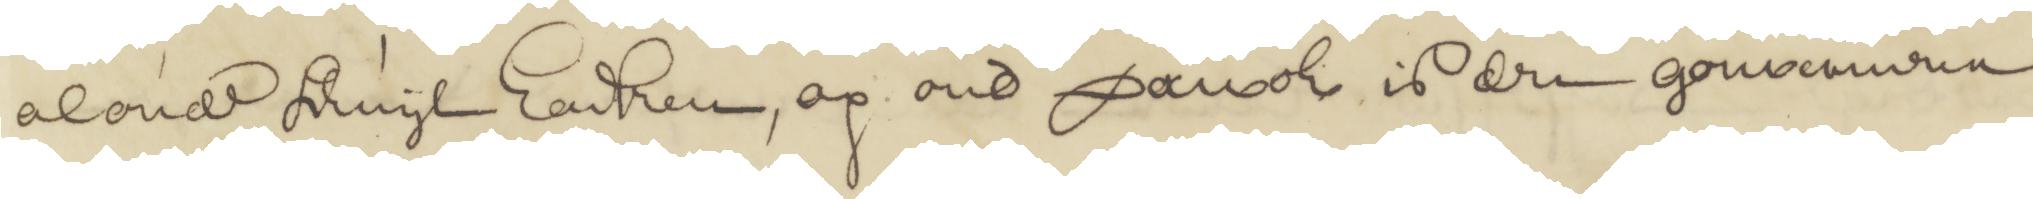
aloude schuijl haeken, op oud pawoh is den gouverneur
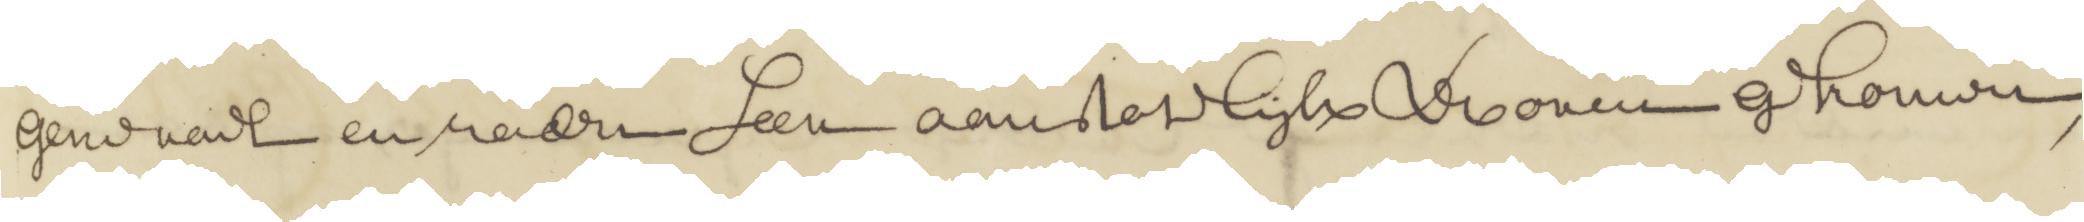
generael en raden seer aanstotelijk tevoren gekomen,
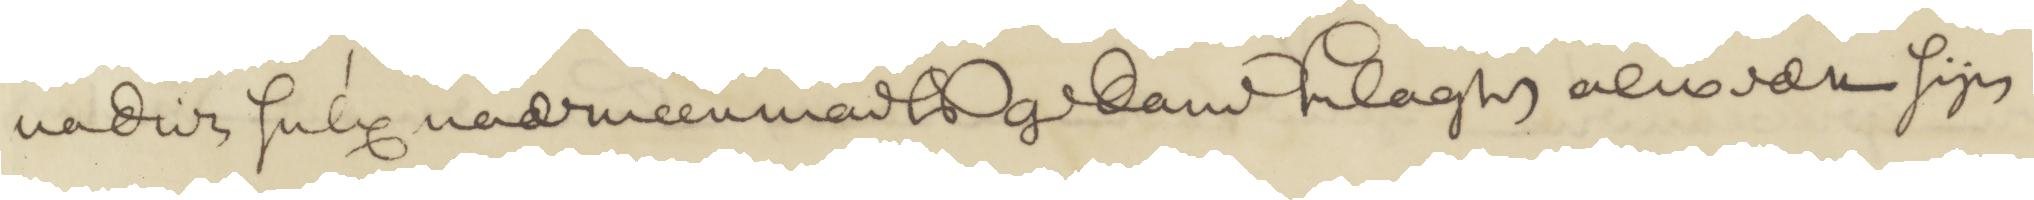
nadien sulx na demeermaels gedane klagten alweer sijn
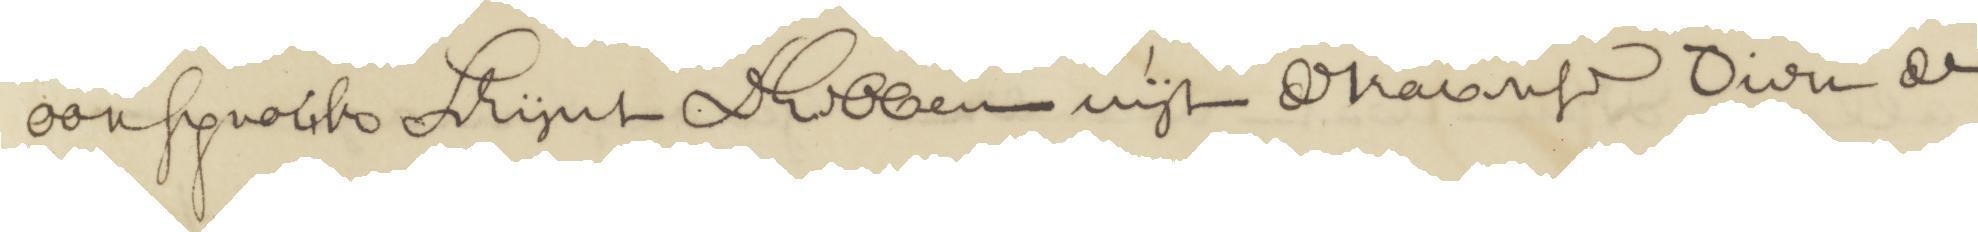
oorspronk schijnt tehebben uijt detraverse dien de
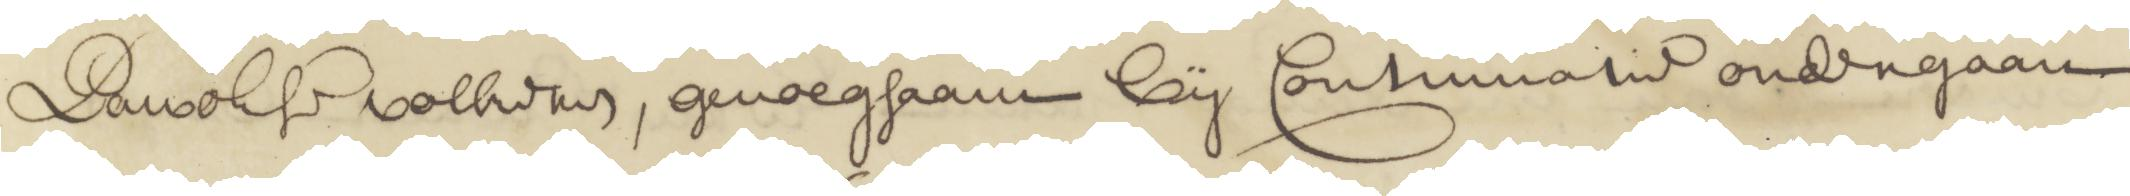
Pawohse volkeren, genoegsaam bij continuatie ondergaan
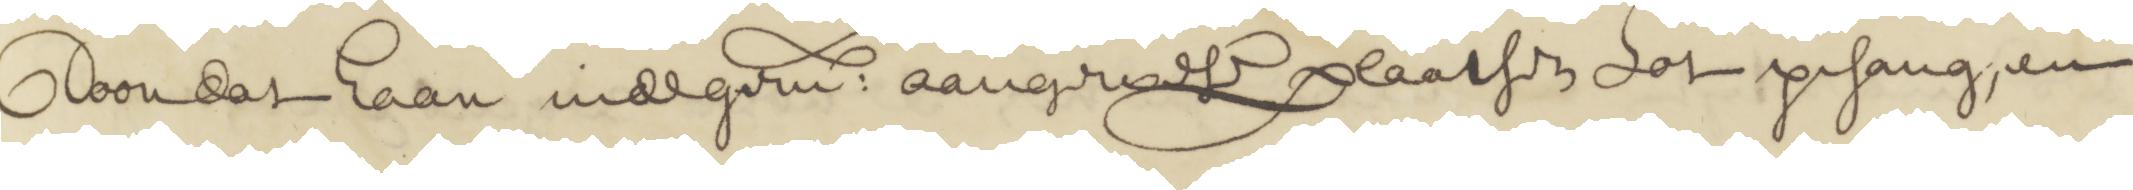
door dat haar in de gem: aangewese plaatsen tot pisang, en
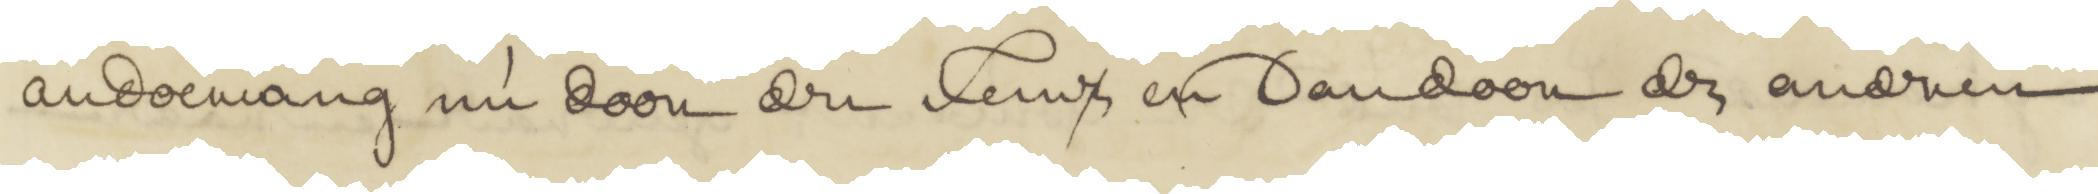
andoeriang nu door den Eenen en dan door den anderen
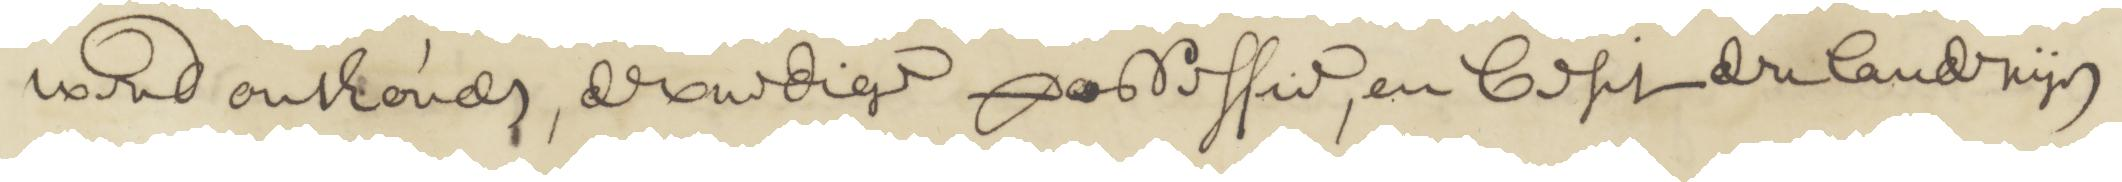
werd onthouden, levendige possessie, en besit der landerijen
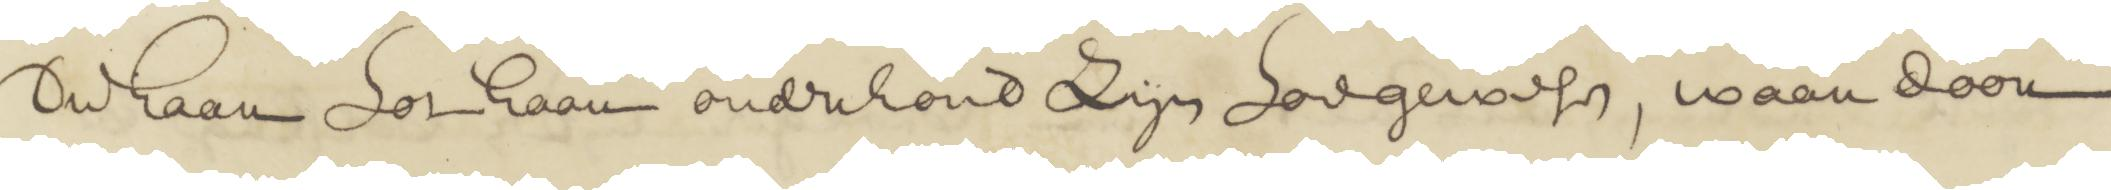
die haar tot haar onderhoud zijn toegewesen, waar door
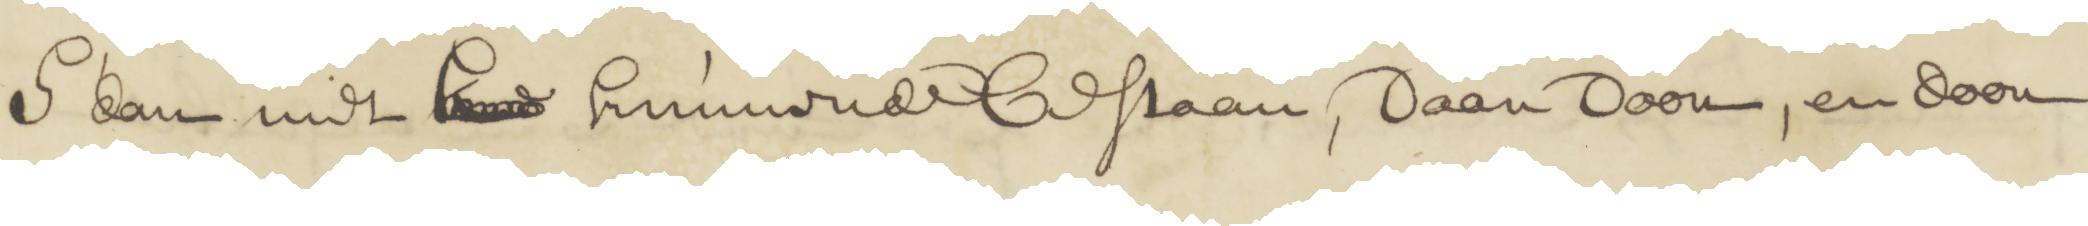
S dan niet konn kunnende bestaan, daar door, en door
